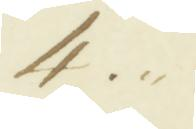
4.„
